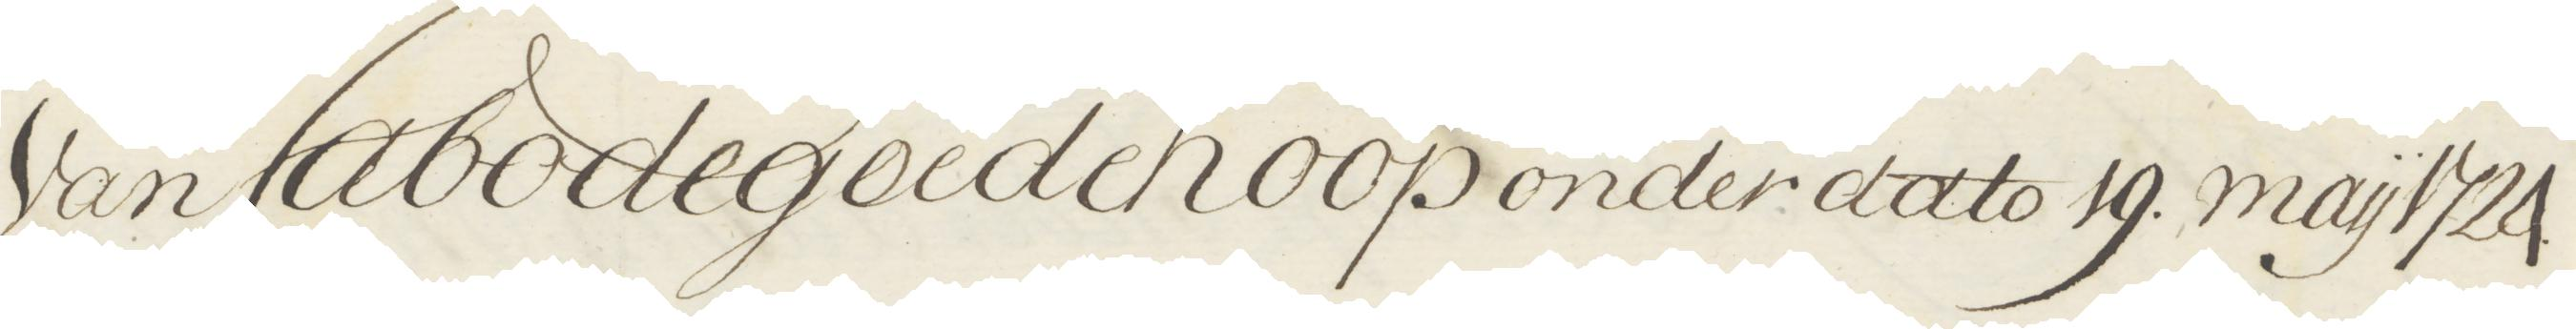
van Cabo de goedehoop onder dato 19. maij 1724.
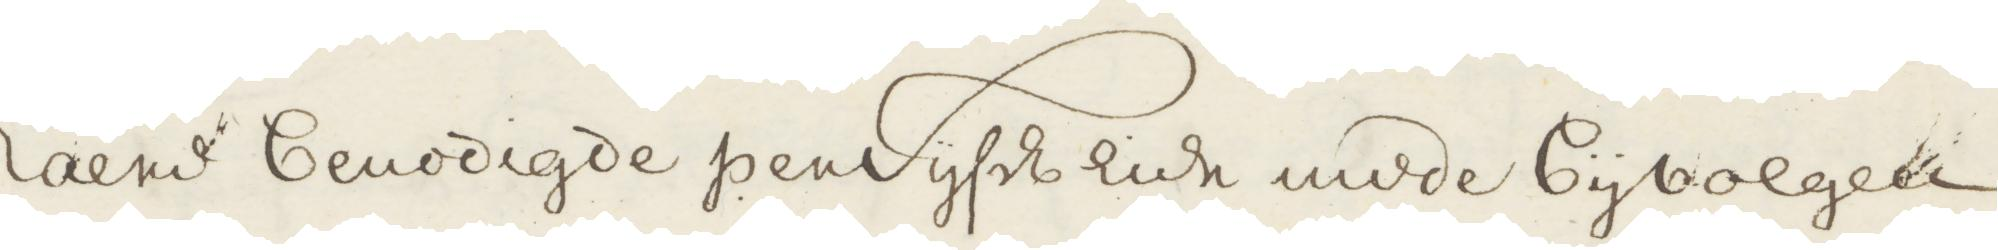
haere benodigde per Eijsch hier mede bijvolgen
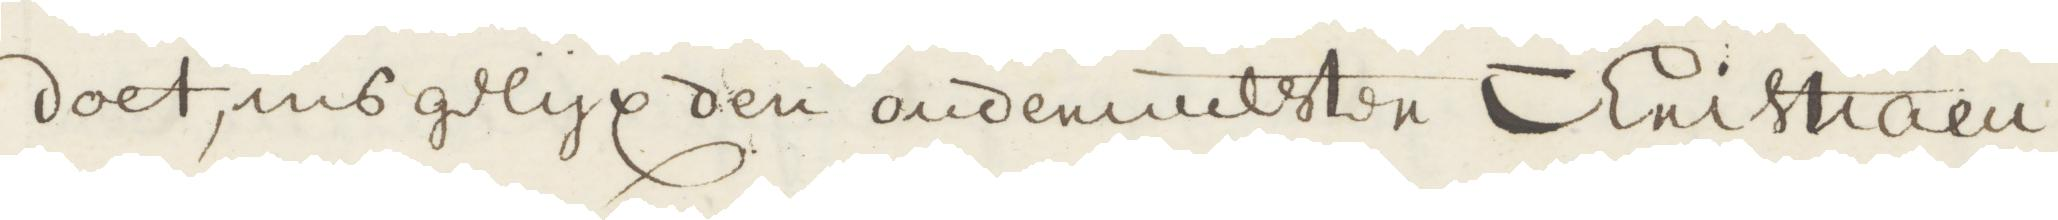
doet, ins gelijx den ondermeester Christiaen
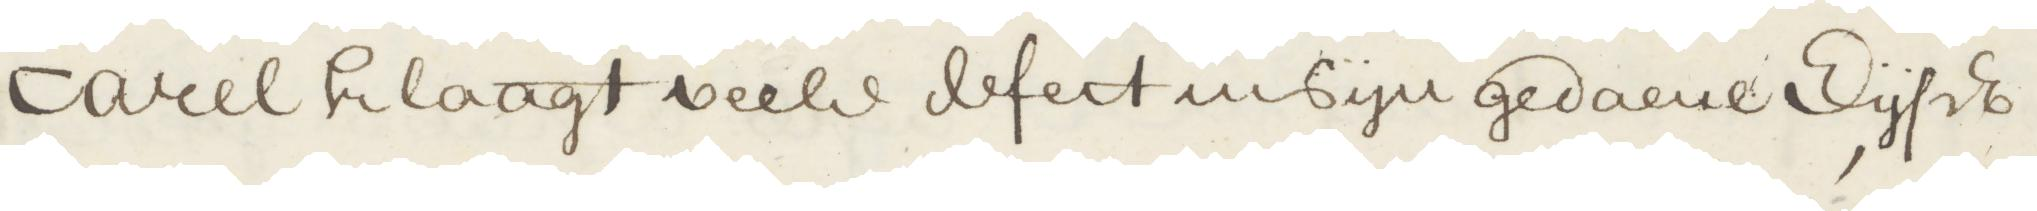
carel klaagt veele defect in sijn gedaene Eijsch
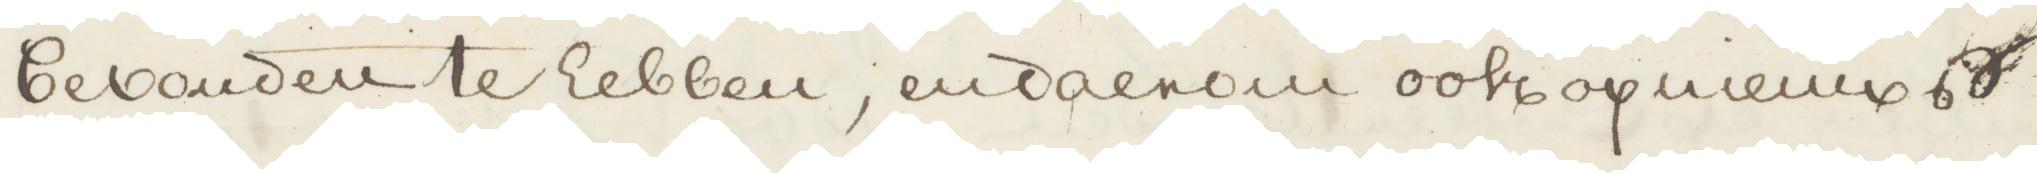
bevonden te hebben; en daerom ook op nieuw d
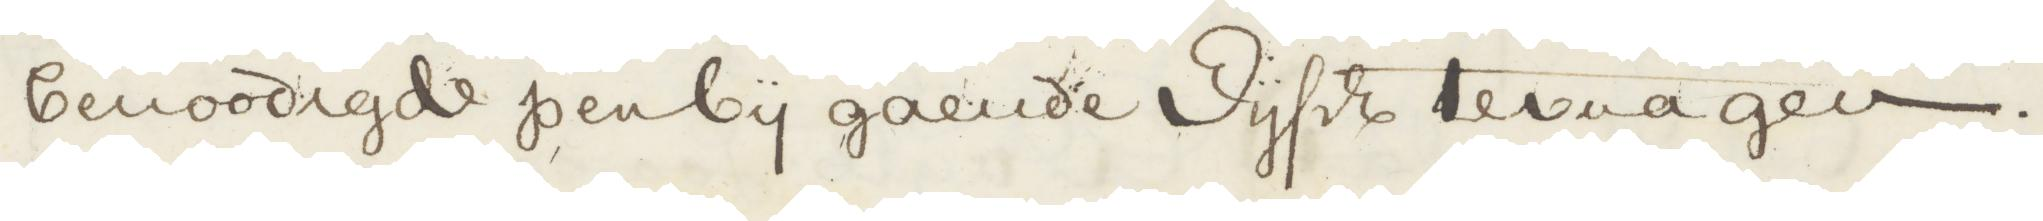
benoodigde per bij gaende Eijsch tevragen.
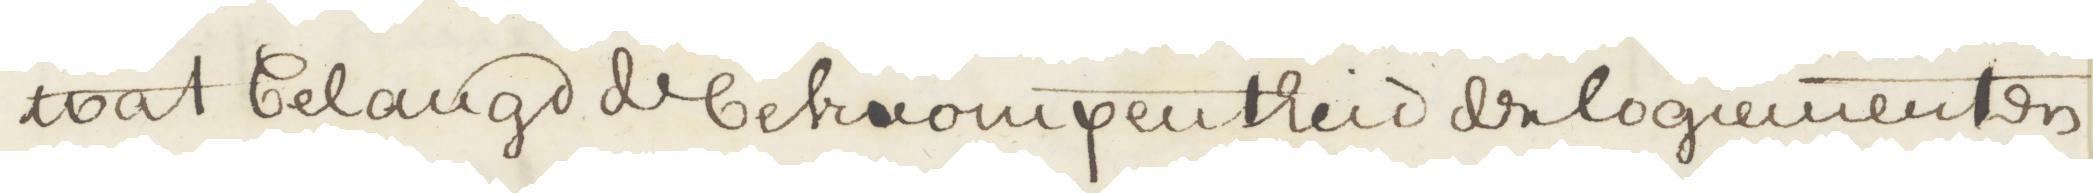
wat belangd de bekrompentheid der logiementen
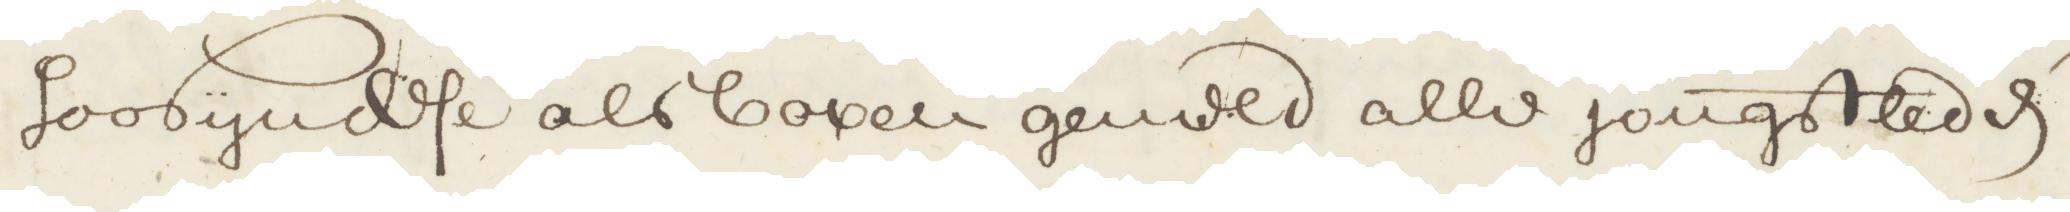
soo sijn dese als boven gemeld alle jongstleden
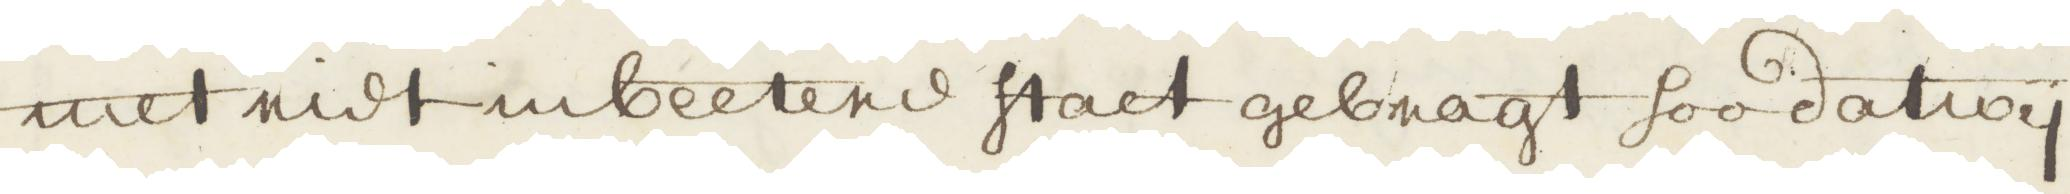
met riet inbeetere staet gebragt soo dat wij
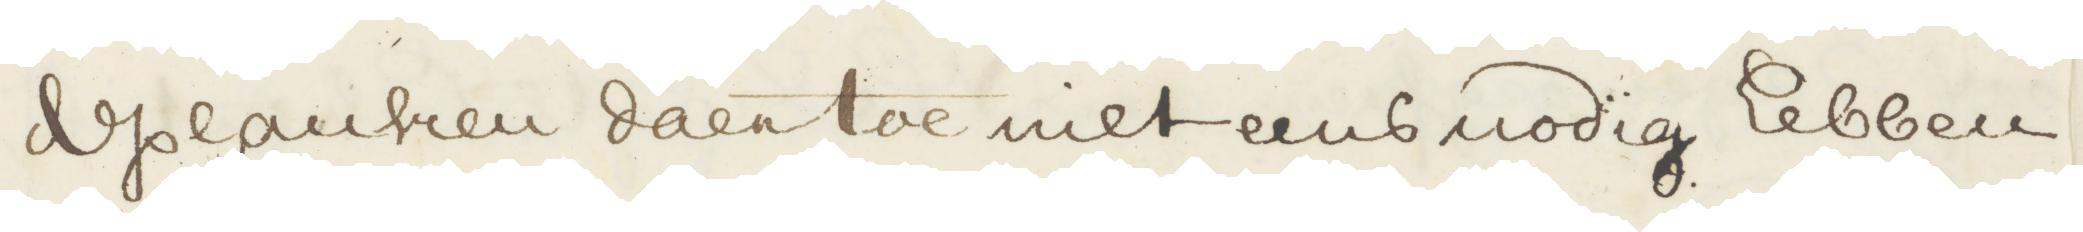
deplanken daer toe niet eens nodig hebben
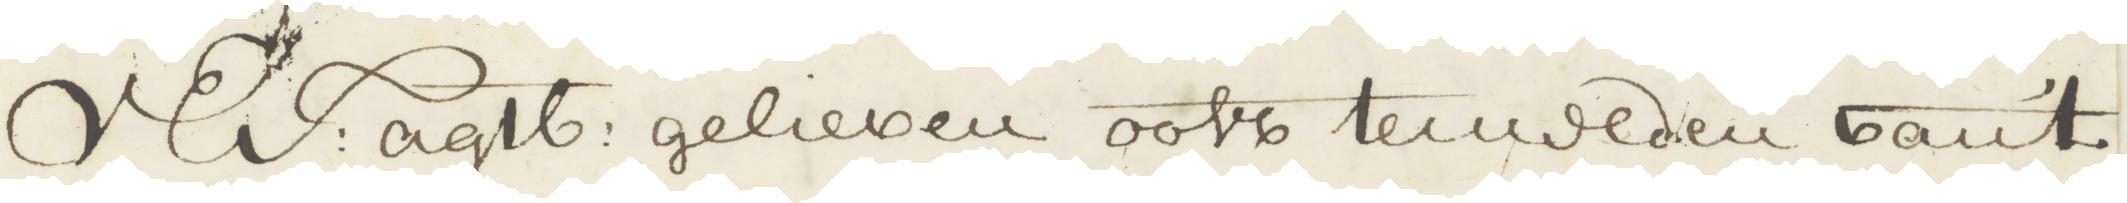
VEE: agtb: gelieven ook temelden van’t
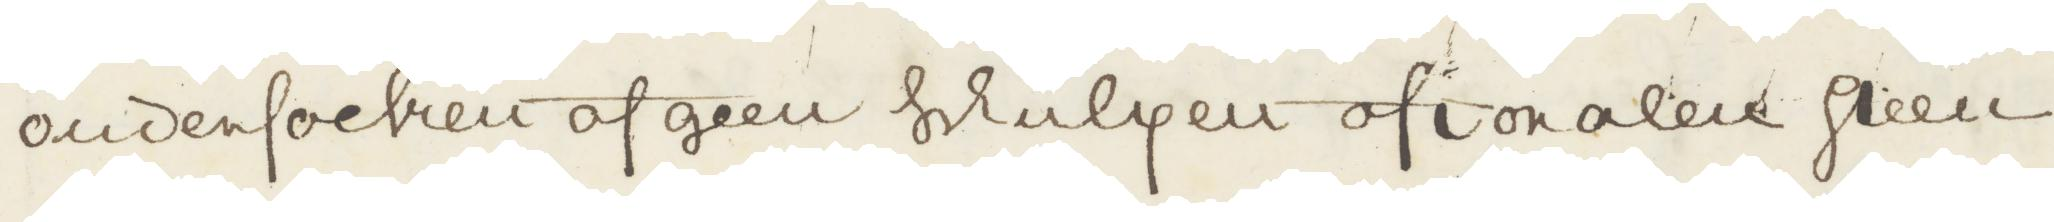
ondersoeken of geen schulpen of coralen steen
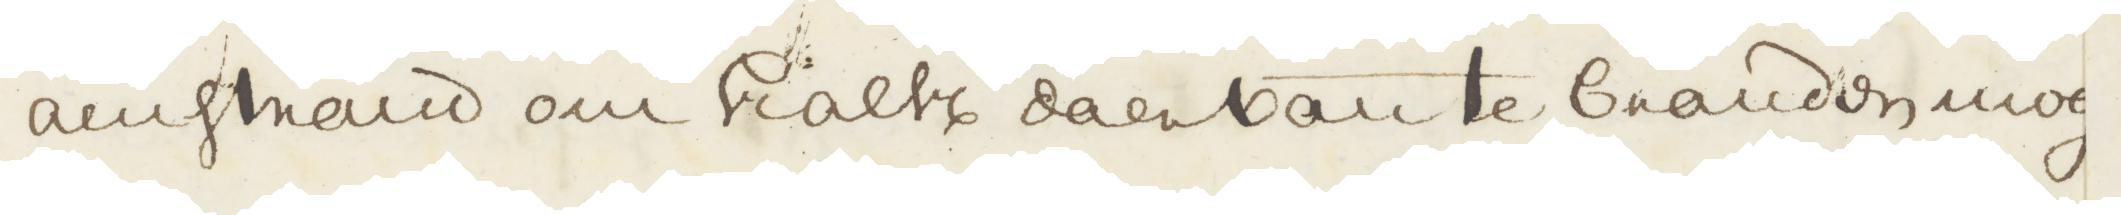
aenstrand om kalk daervan te branden mog
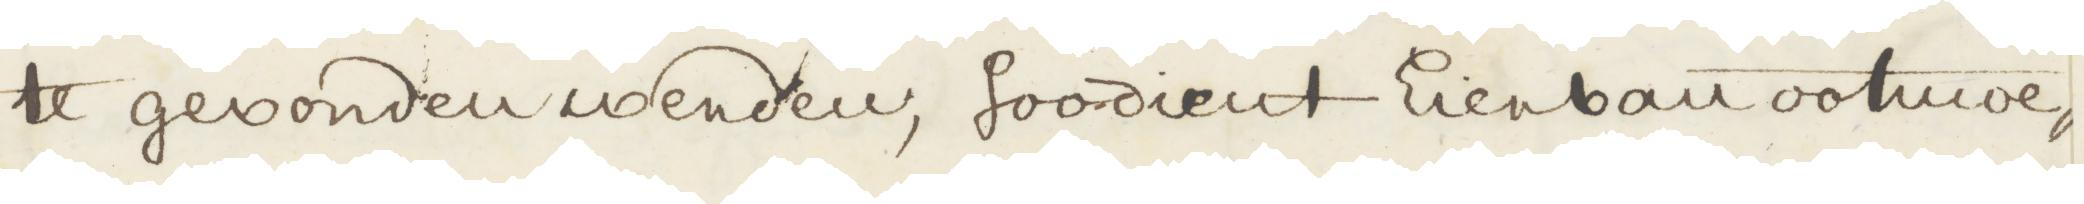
te gevonden werden, soodient hier van ootmoe„
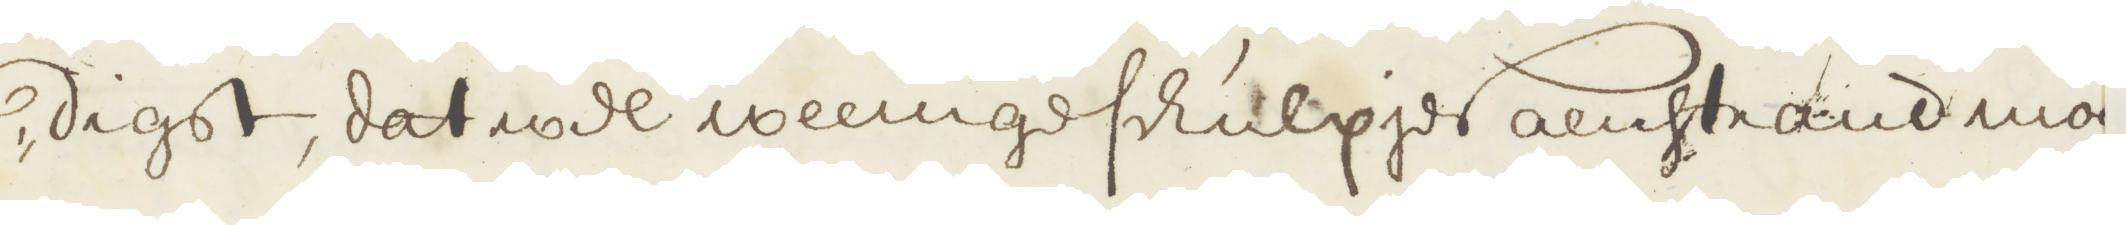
„digst, dat wel weenige schulpjes aenstrand mo
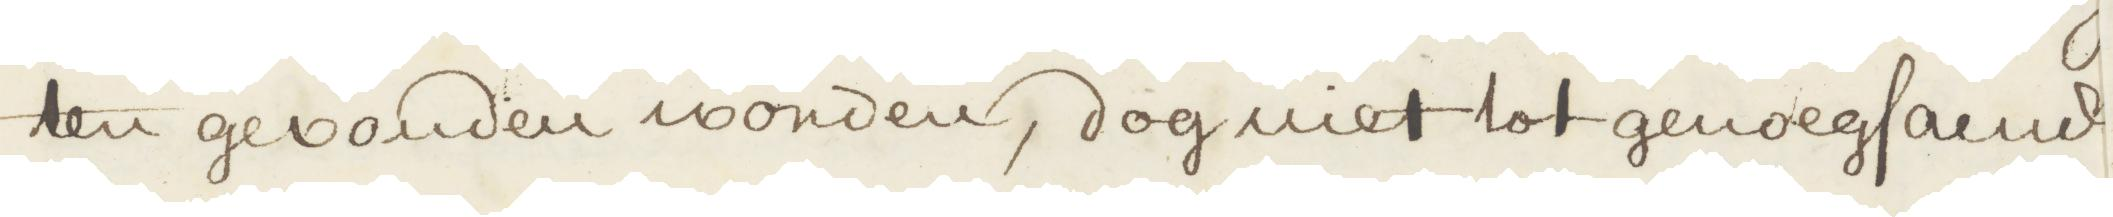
ten gevonden worden, dog niet tot genoegsaeme
